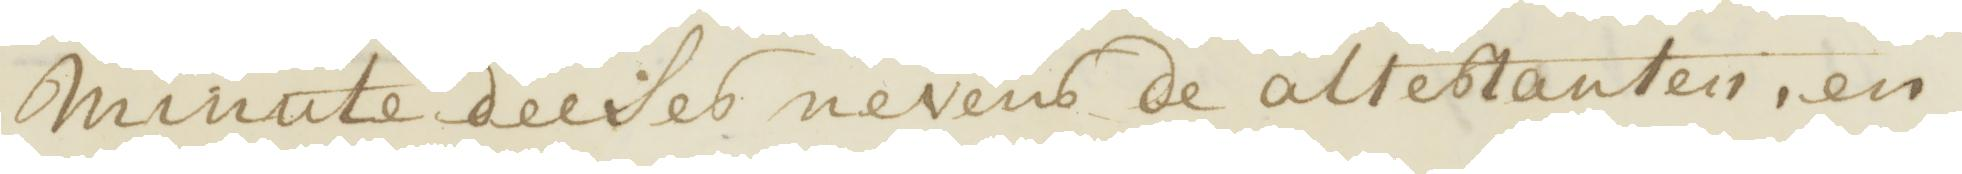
minute deeses nevens de attestanten, en
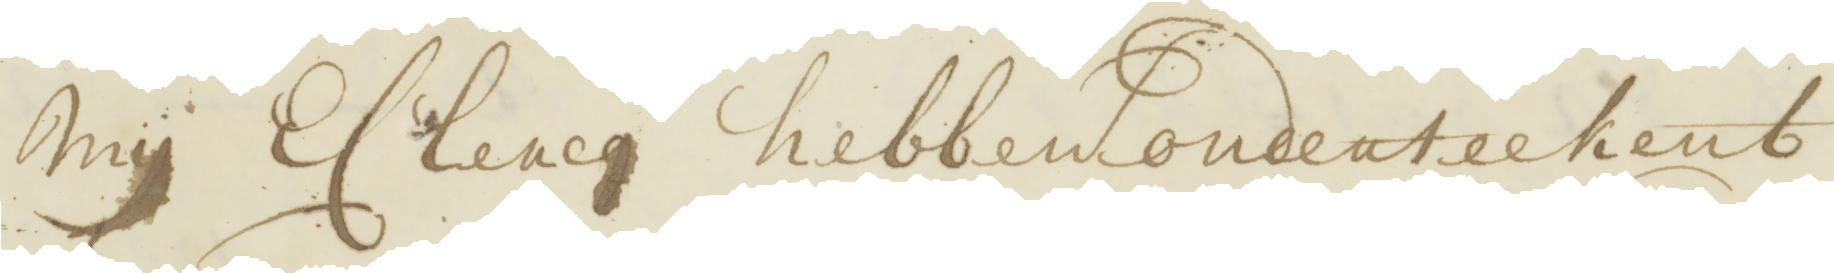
mij E Clercq hebben onderteekent
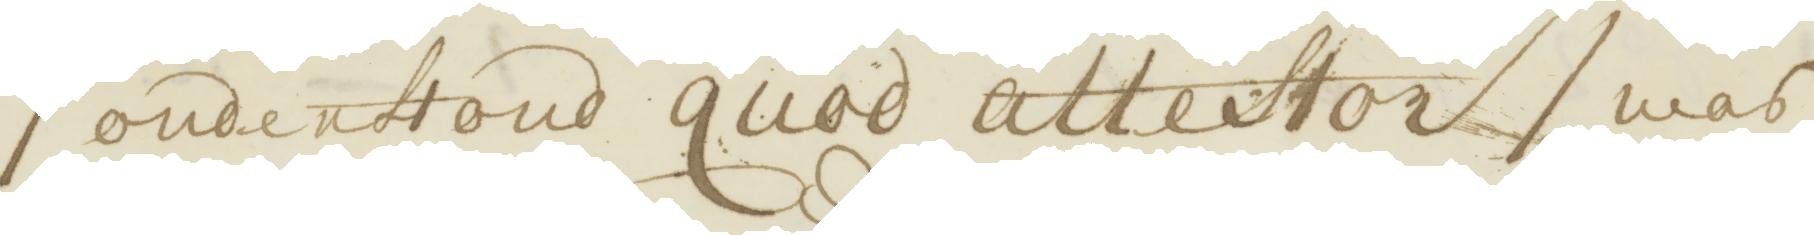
/onderstond quod attestor/ was
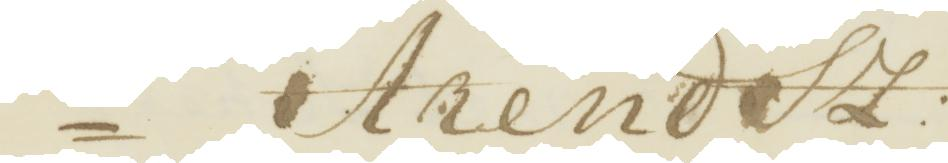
D=l Arendsz:
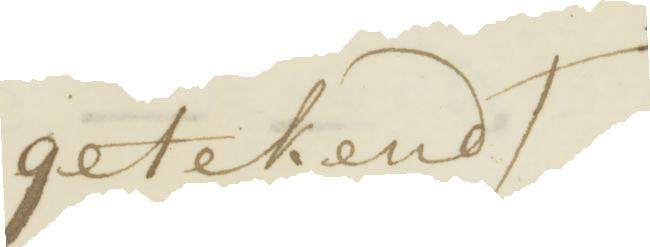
getekend/
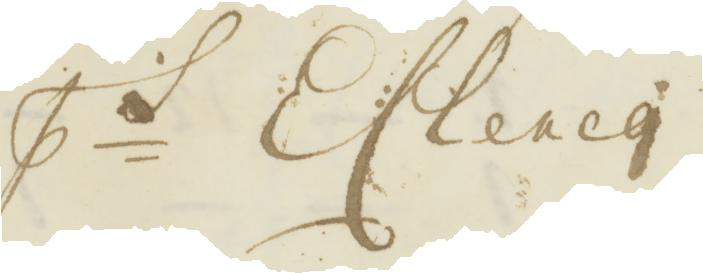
p=s E: Clercq
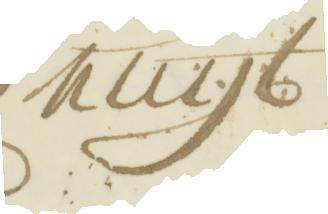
Cruijt
